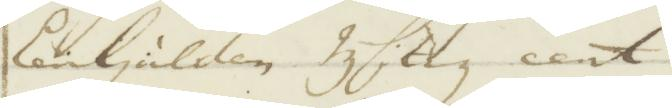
Een Gulden vijftig cent
